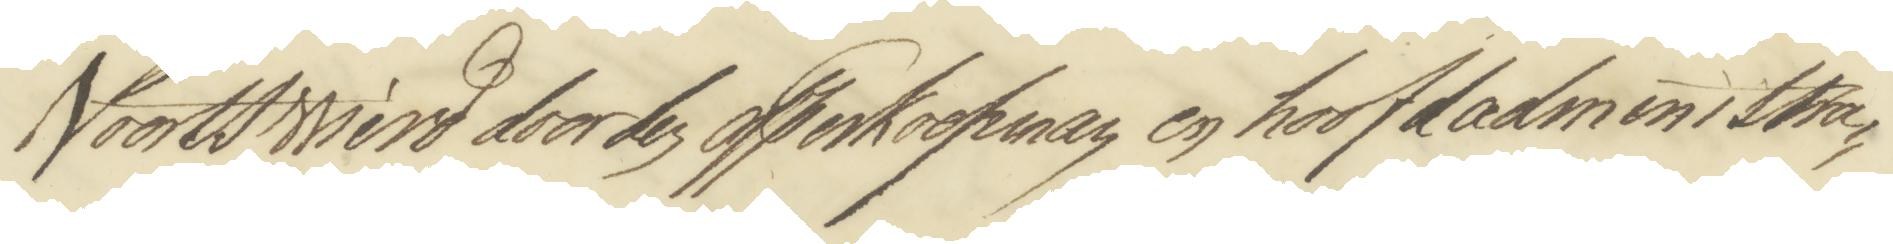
Voorts wierd door den opperkoopman en hoofd administra„
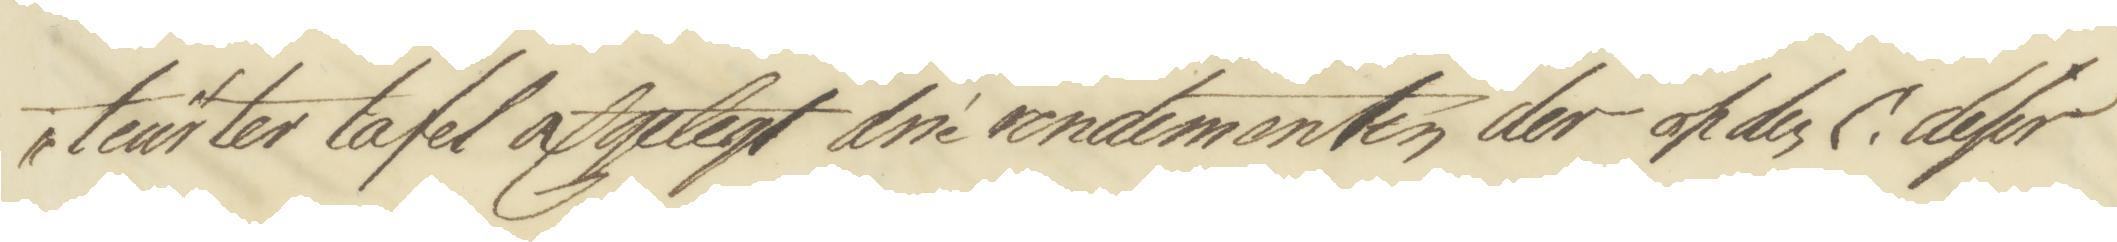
„teur ter tafel afgelegt drie rendementen der op den 5. deser
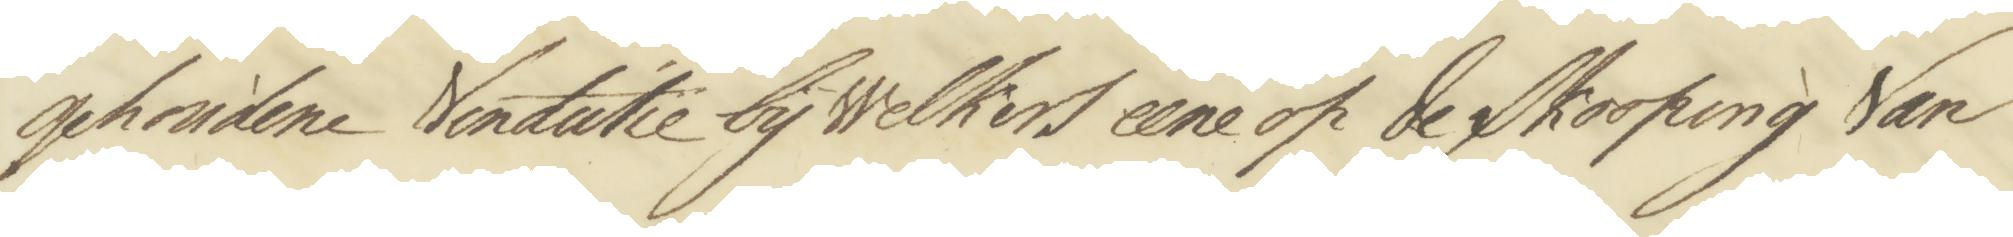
gehoudene vendutie bij welkers eene op de verkooping van
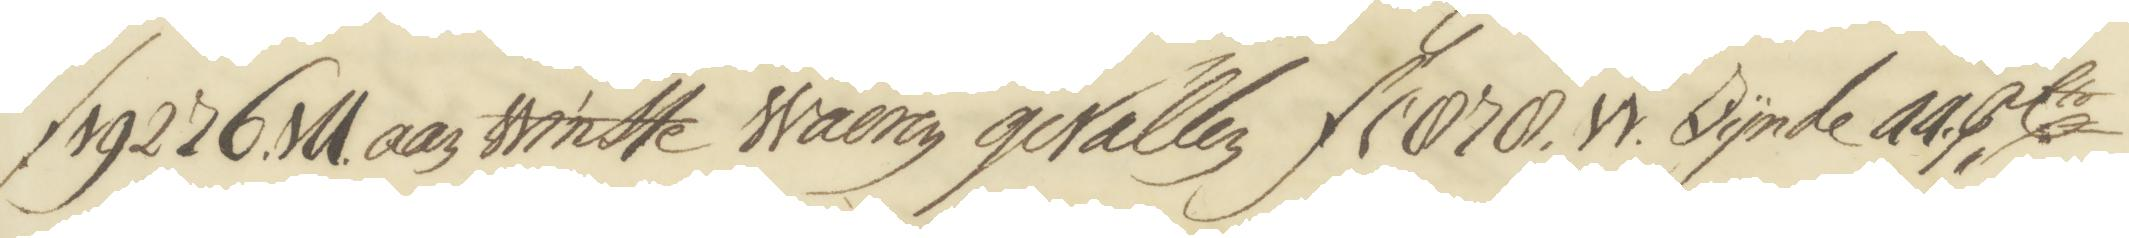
ƒ19276.14. aan winste Waeren gevallen ƒ5878.11. zijnde 44. p„rC=to
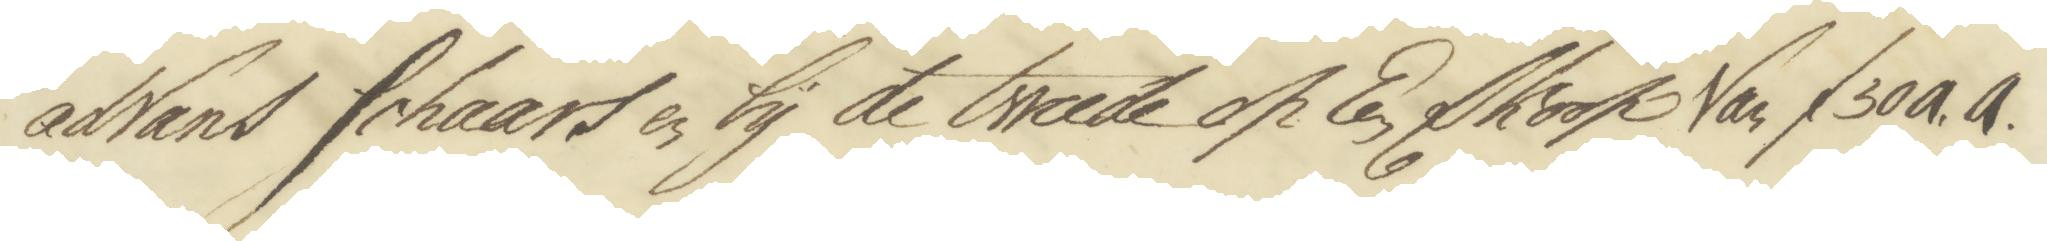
advans schaars en bij de tweede op Een verkoop van ƒ304.4.
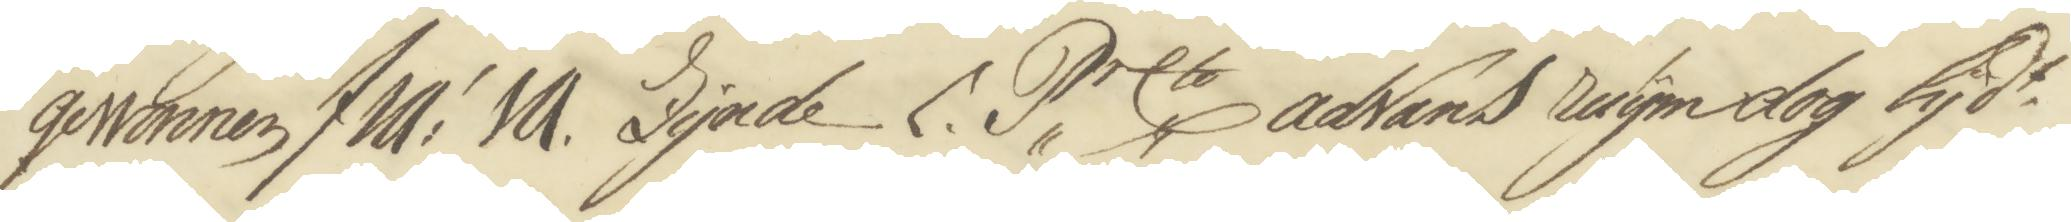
gewonnen ƒ14:'14. zijnde 5. P„rC„to advans ruijm dog lijd.t
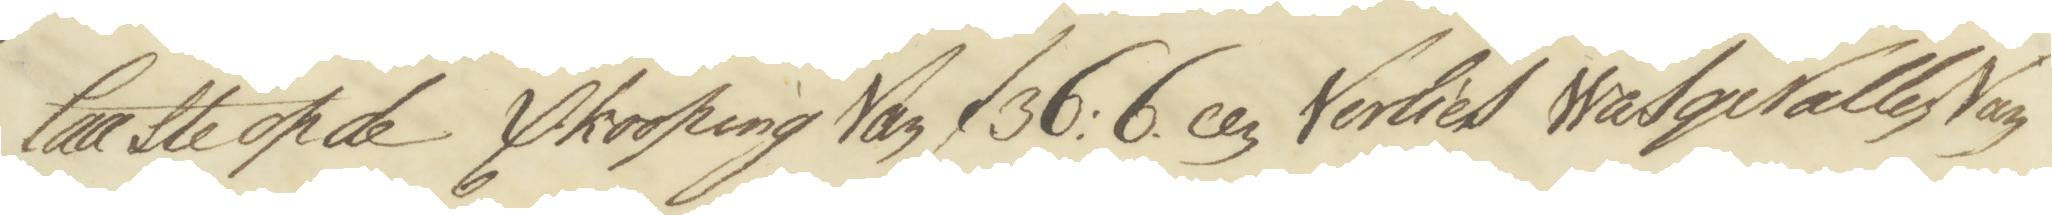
laaste op de verkooping van ƒ36:6. een Verlies was gevallen van
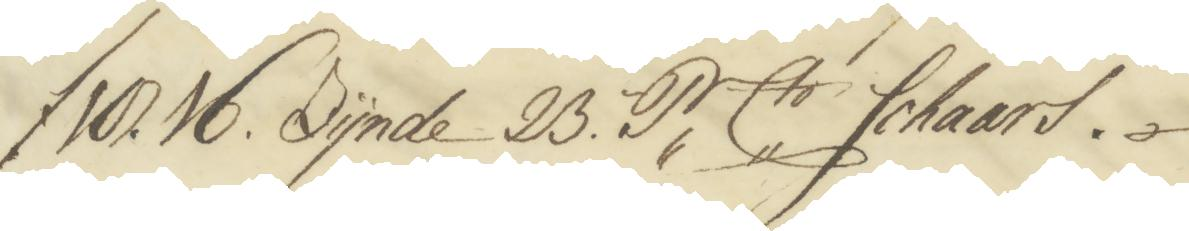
ƒ18:16. zijnde 23: P„rC„to schaars.—
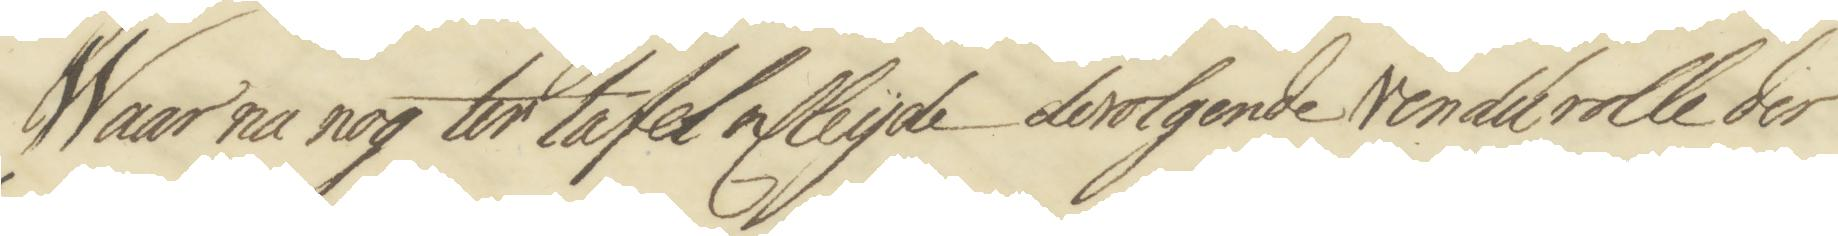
Waar na nog ter tafel overleijde de volgende vendurolle der
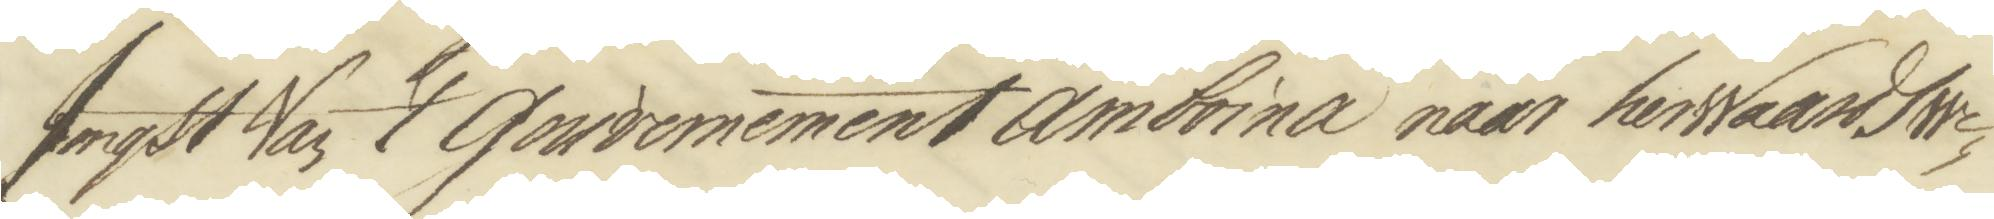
Jongst van ’t Gouvernement amboina naar herwaards we„
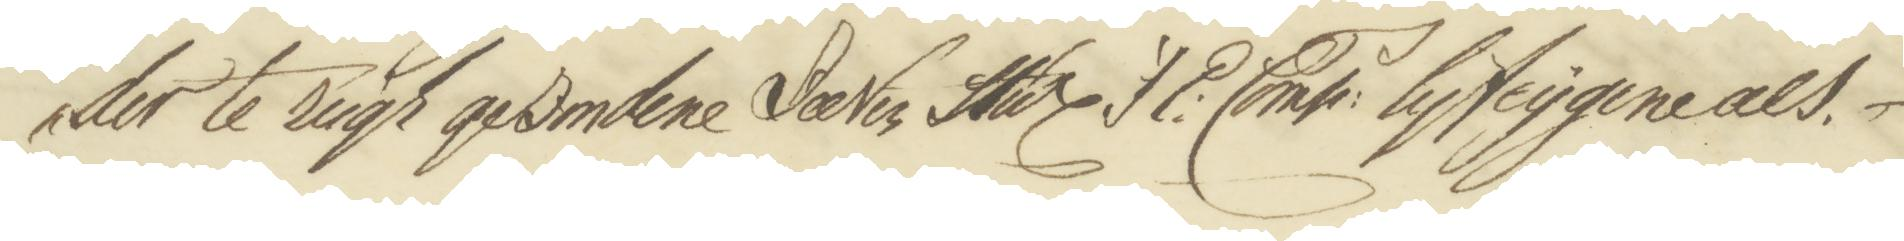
der te rugh gezondene zeeven stux 's E: Comp:s lyfeijgene als.—
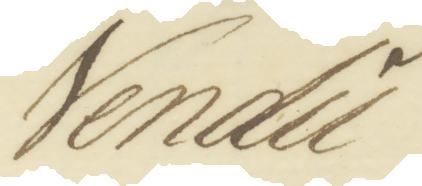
Vendu
